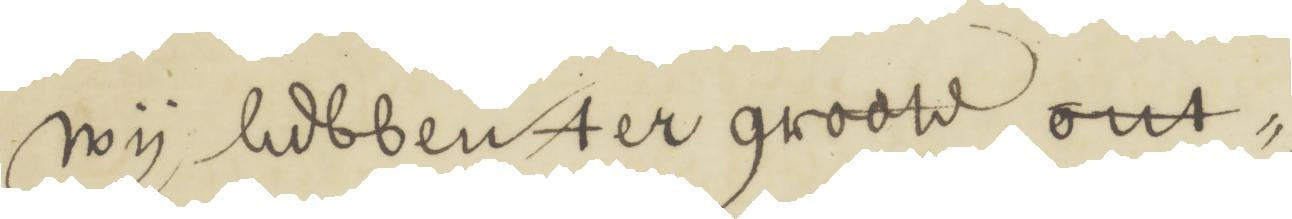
wij hebben ter groote ont„
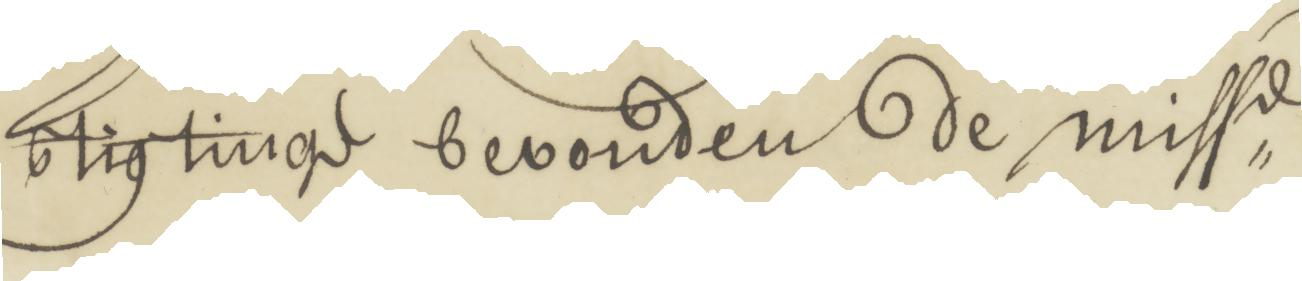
stigtinge bevonden de miss„e
